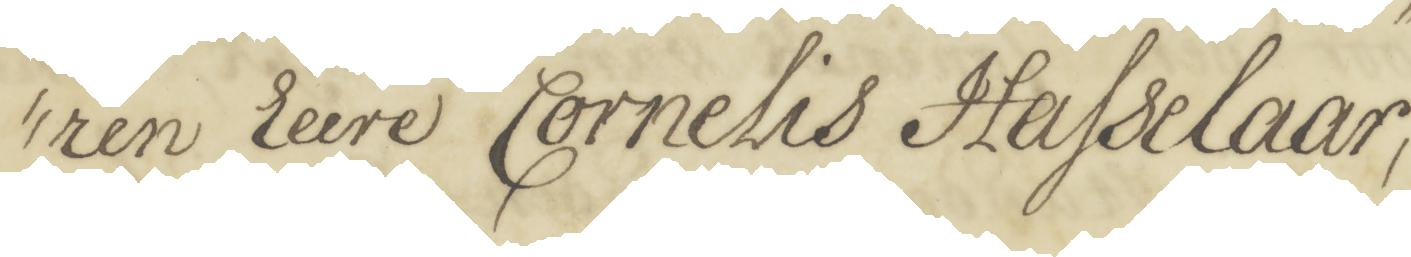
„ren heere Cornelis Hasselaar,
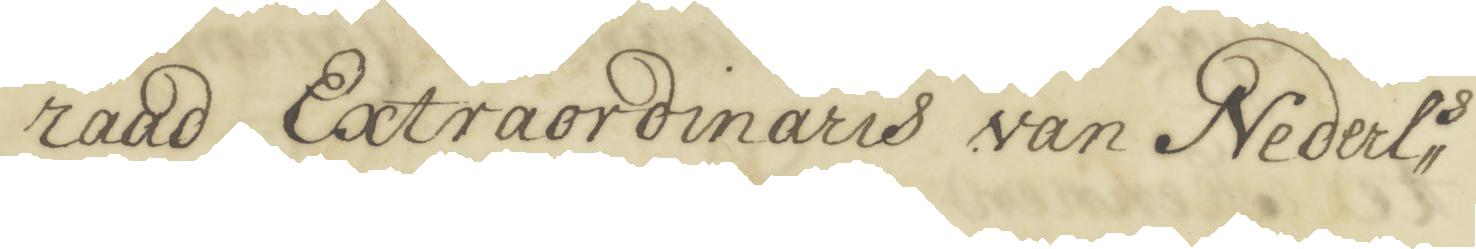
raad Extraordinaris van Nederl„s
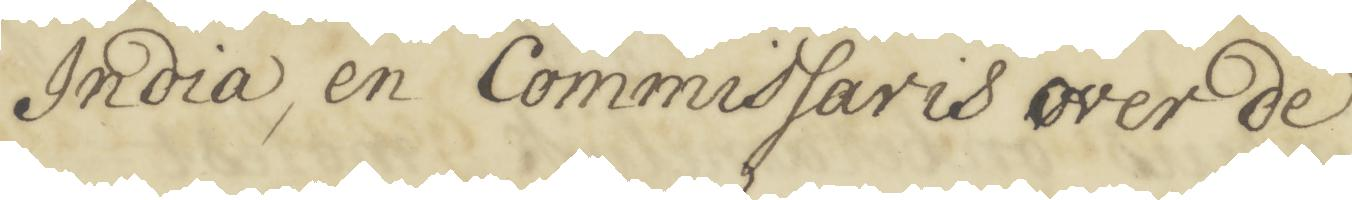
India, en Commissaris over de
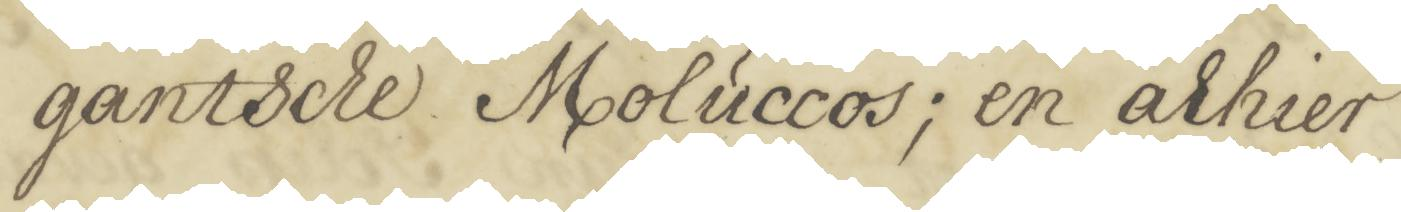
gantsche Moluccos; en alhier
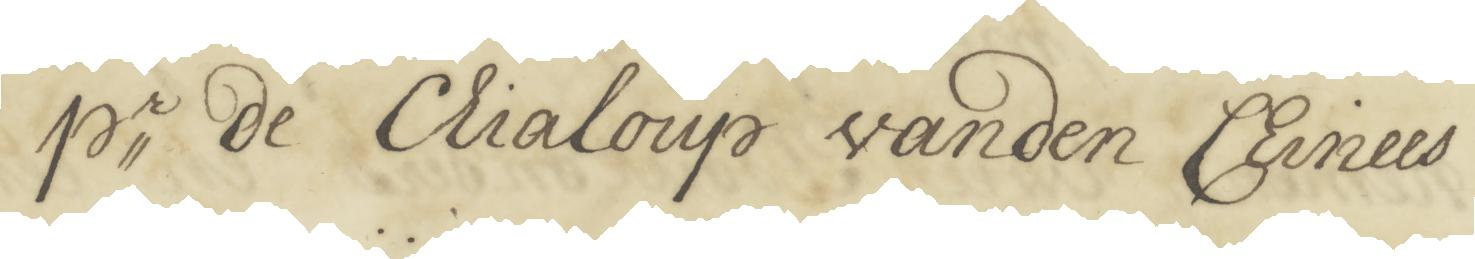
p„r de Chialoup vanden Chinees
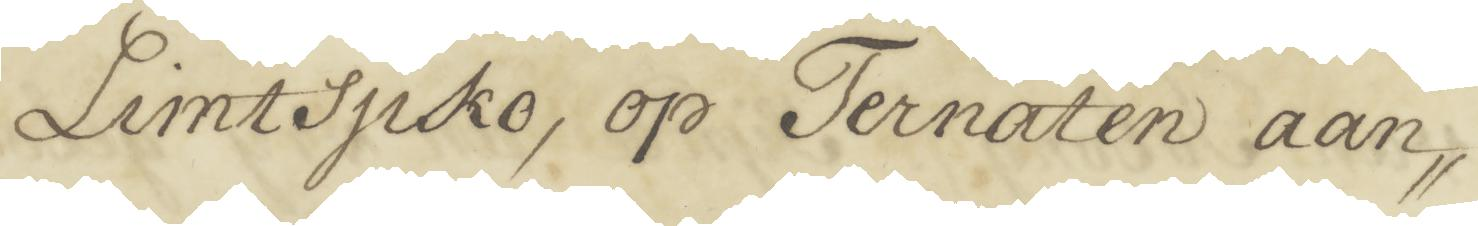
Limtsjiko, op Ternaten aan„
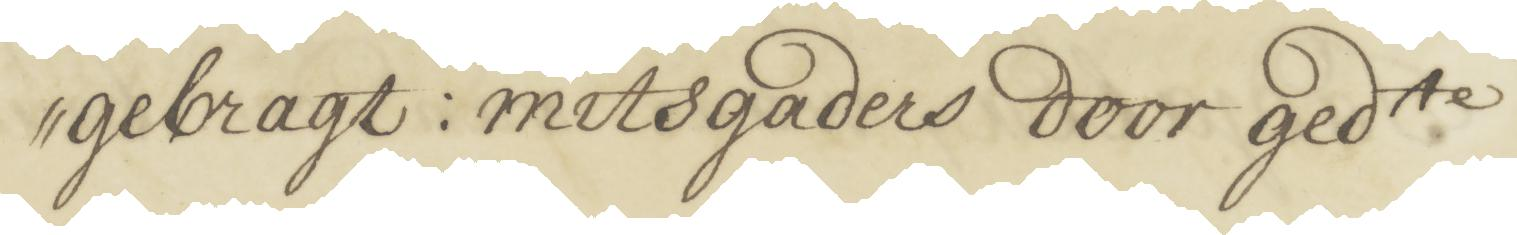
„gebragt: mitsgaders door gedte
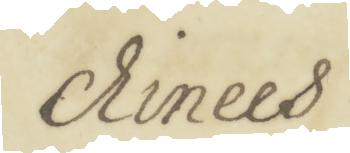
chinees
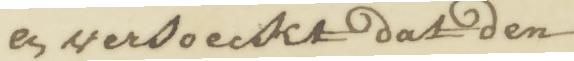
en versoeckt dat den
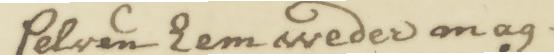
selven hem weder mag
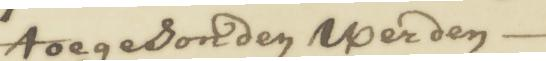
toegesonden werden.
